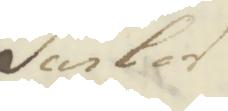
Sarles
